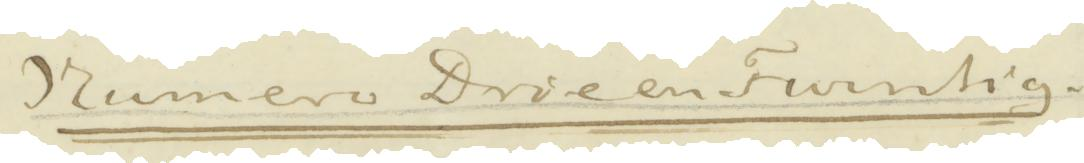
Numero Drie Twintig.
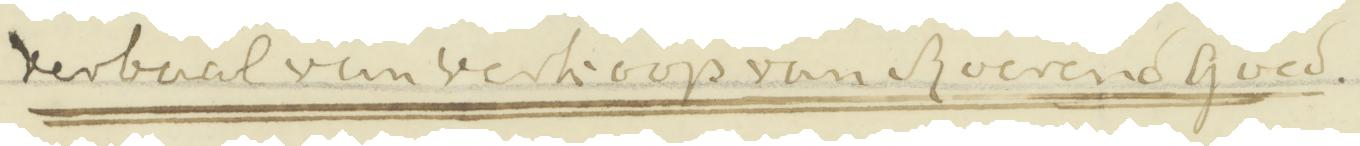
verbaal van verkoop van Roerend Goed.
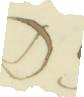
D 9
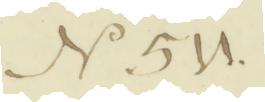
N. 511.
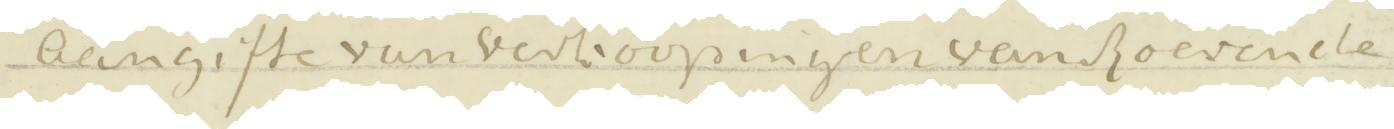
Aangifte van verkoopingen van Roerende
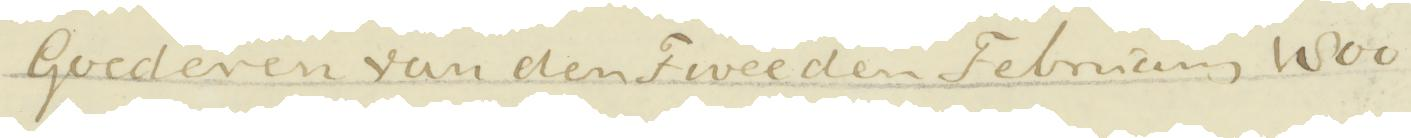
Goederen van den Tweeden February 1800
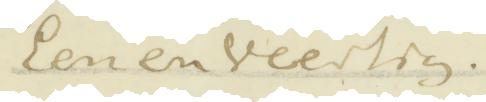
Een en veertig.
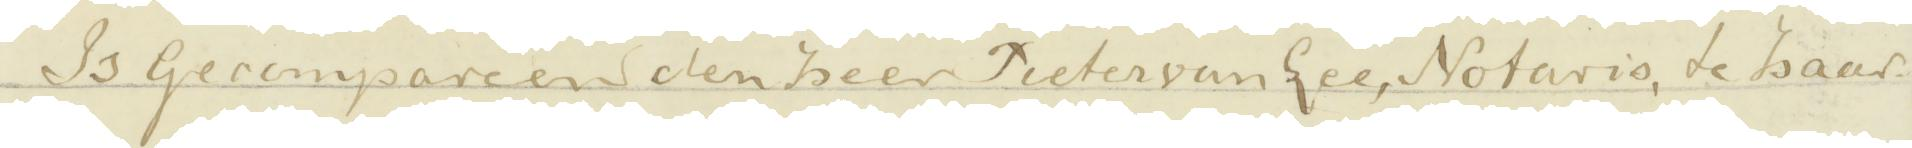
Is Gecompareerd den heer Pieter van Lee, Notaris, te haar
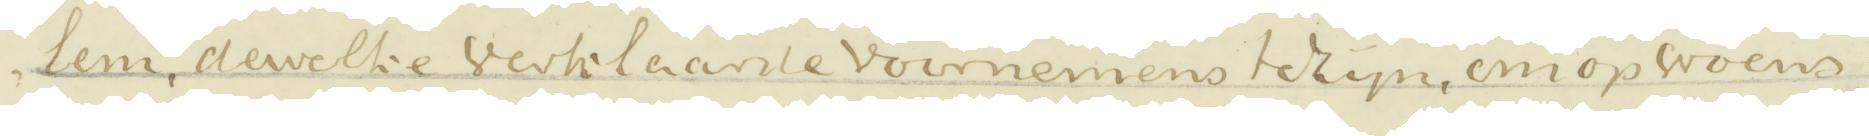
„lem dewelke verklaarde voornemens te Zijn, om op woens
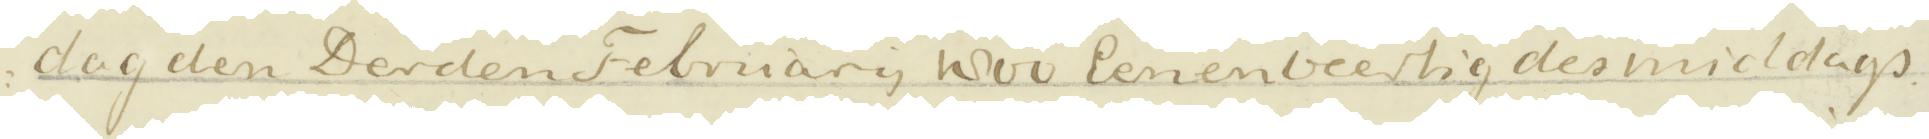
„dag den Derden Februarij 1800 Een en veertig des middags
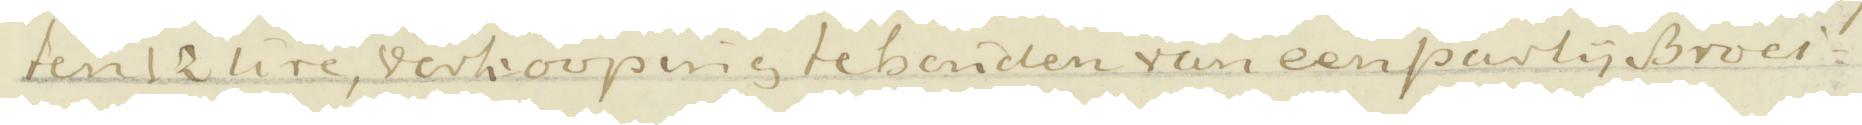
ten 12 ure, verkooping te houden van een partij Broei-
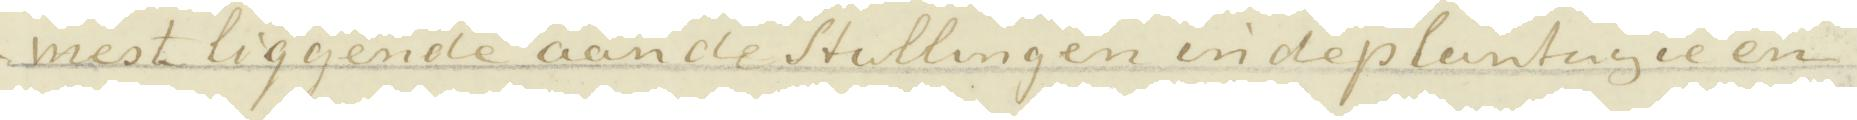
mest liggende aan de stallingen in de plantagie en
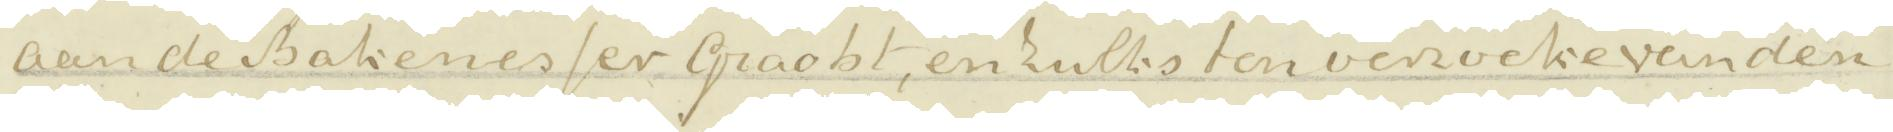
aan de Bakenesser Gracht, en zulks ten verzoeke van den
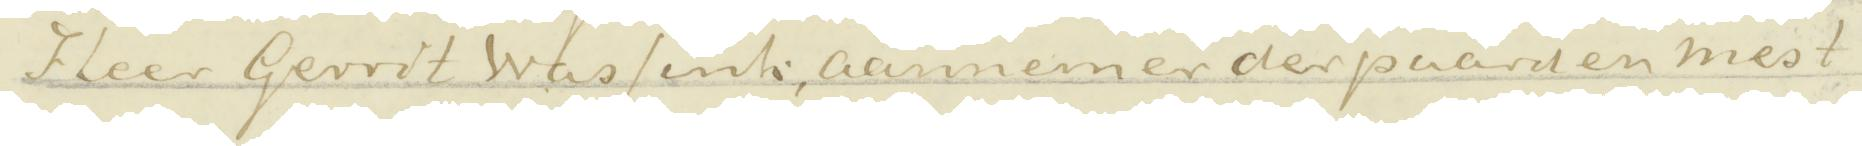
Heer Gerrit Wassink, aannemer der paarden mest
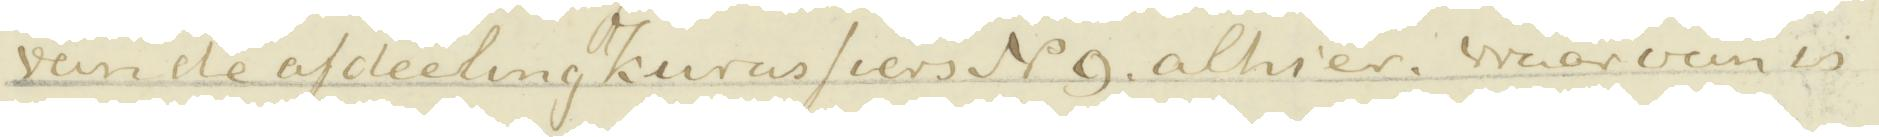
van de afdeeling kurassiers N 9. alhier, waarvan is
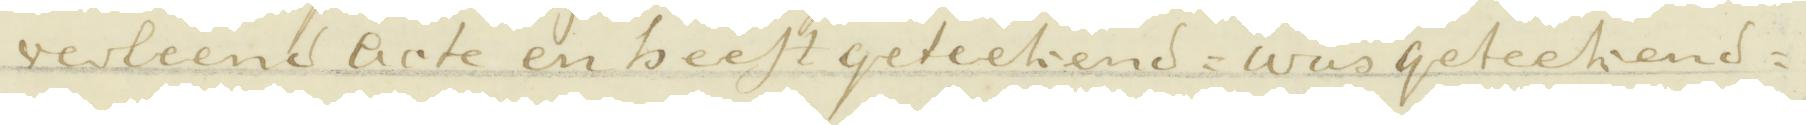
verleend Acte en heeft geteekend = was geteekend=
